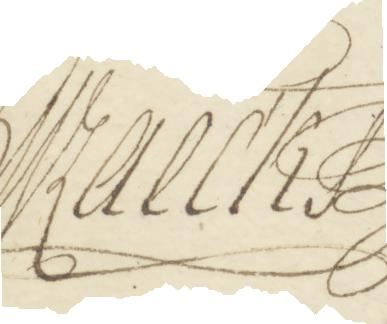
W Izaecks
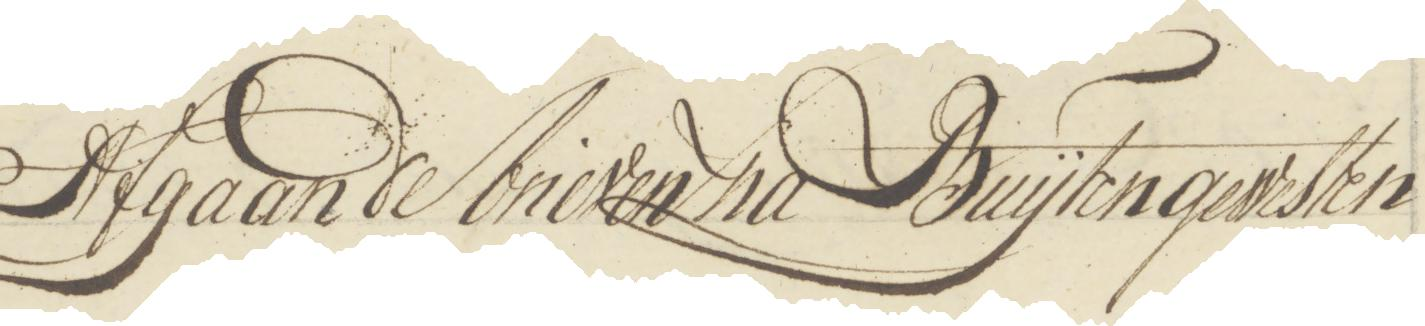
Afgaande brieven na Buijtengewesten
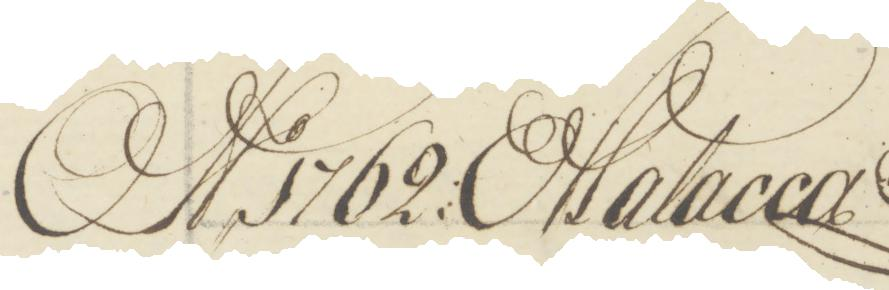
Ao 1762 Malacca
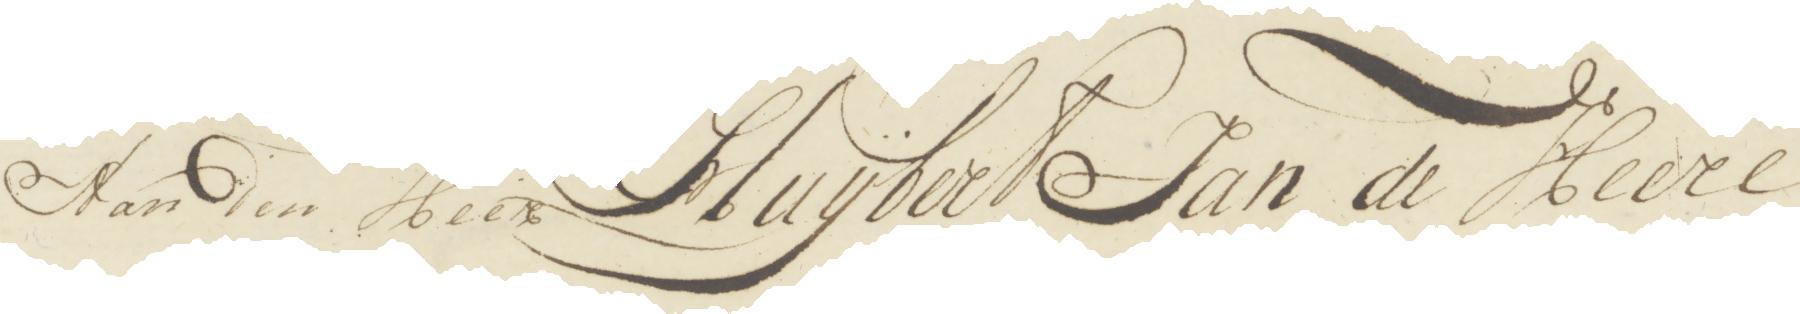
Aan den Heer Huijbert Jan de Heere
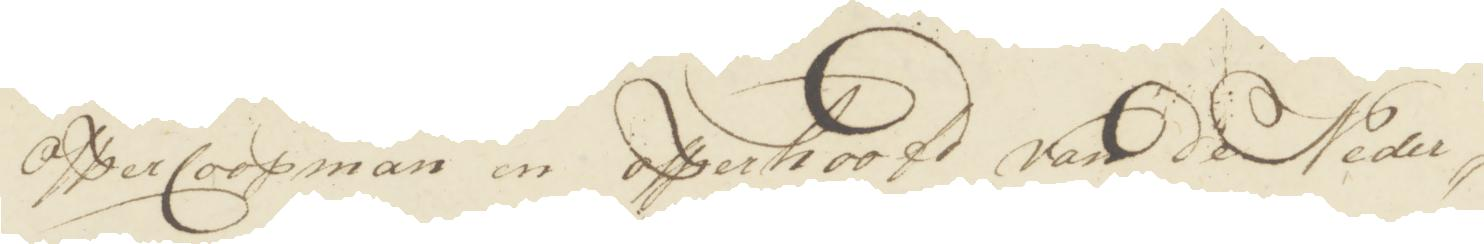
oppercoopman en opperhoofd van de Neder„
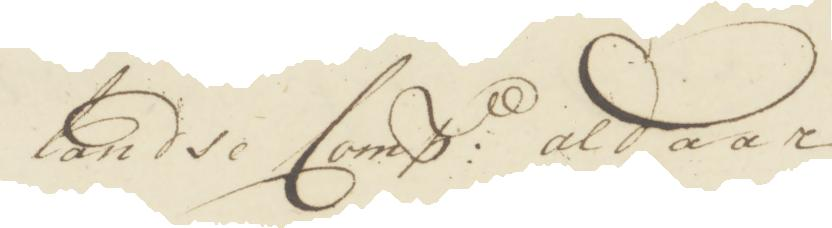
landse Comp:e aldaar
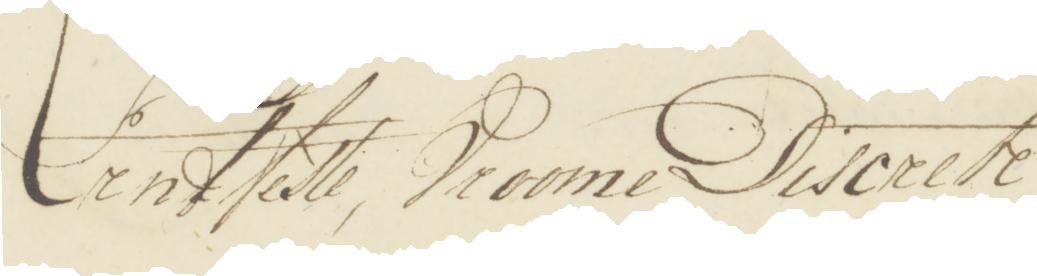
Erntfeste, Vroome Discrete
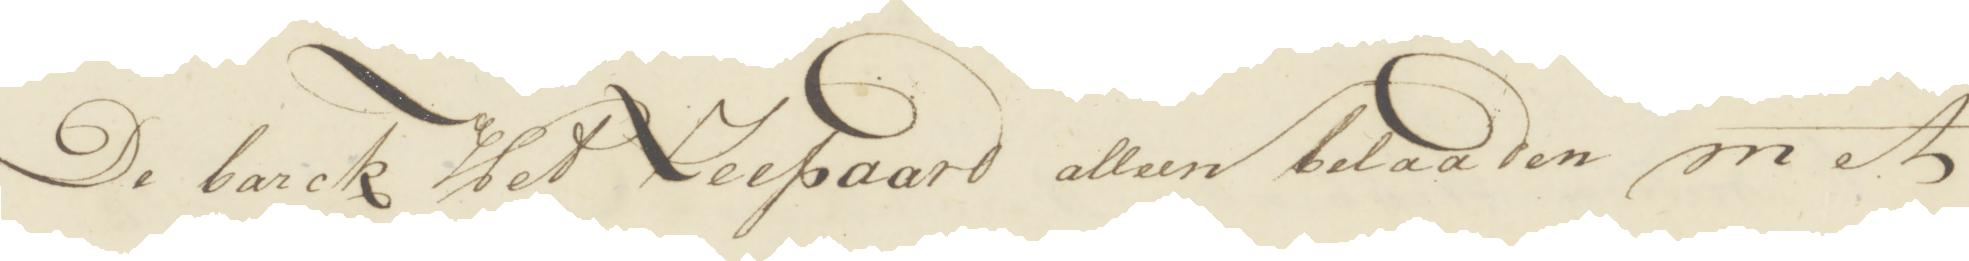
De barck Het Zeepaard alleen belanden met
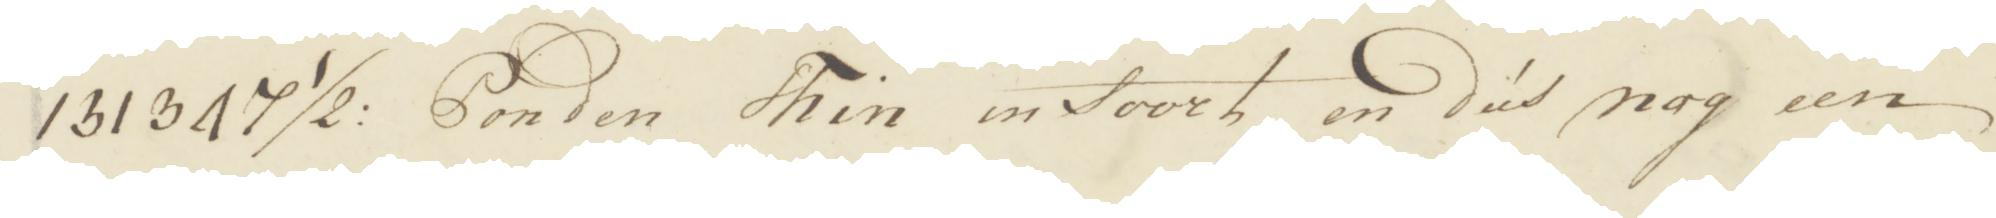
131347½: Ponden thin in soort en dus nog een
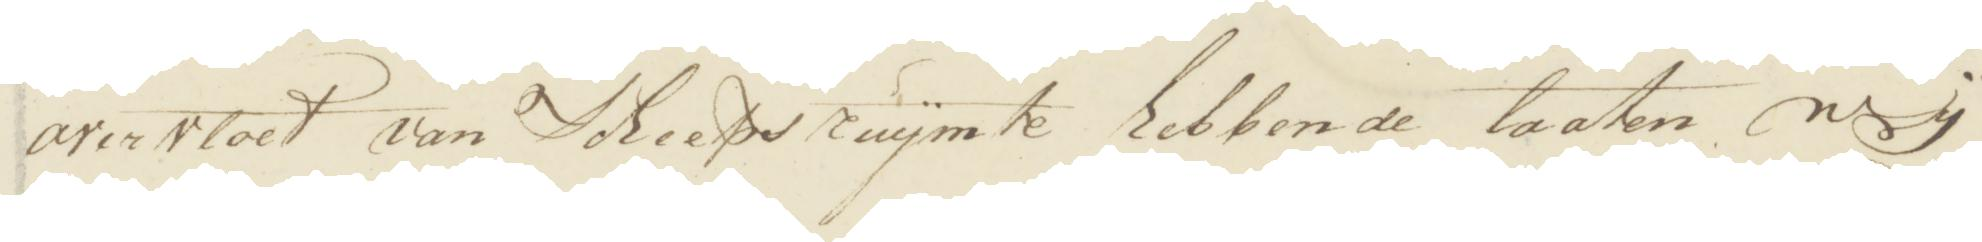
overvloet van scheeps ruijmte hebbende laaten wij
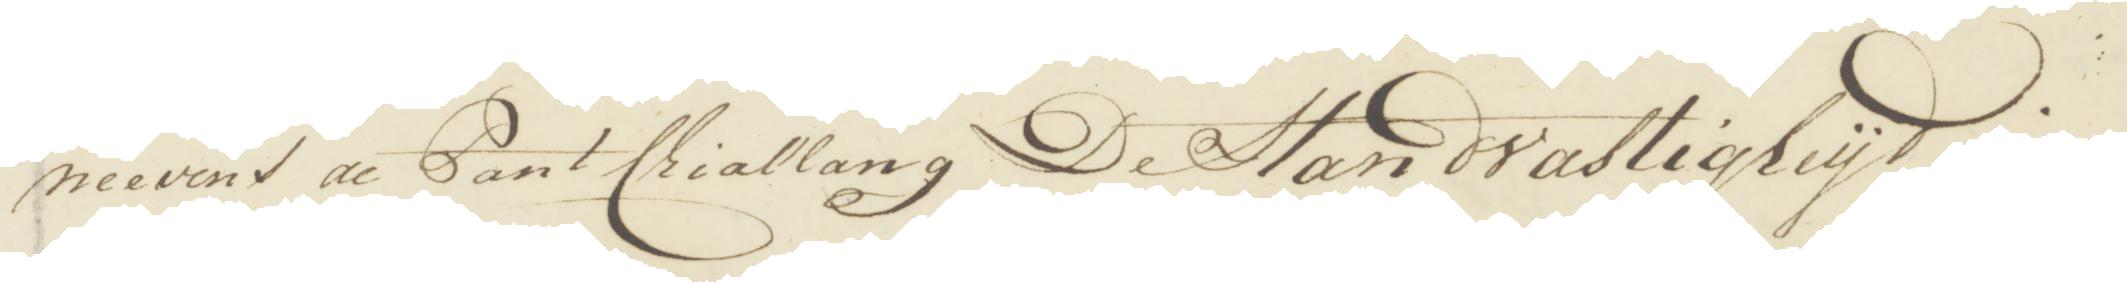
neevens de Pant chiallang De standvastigheijd in
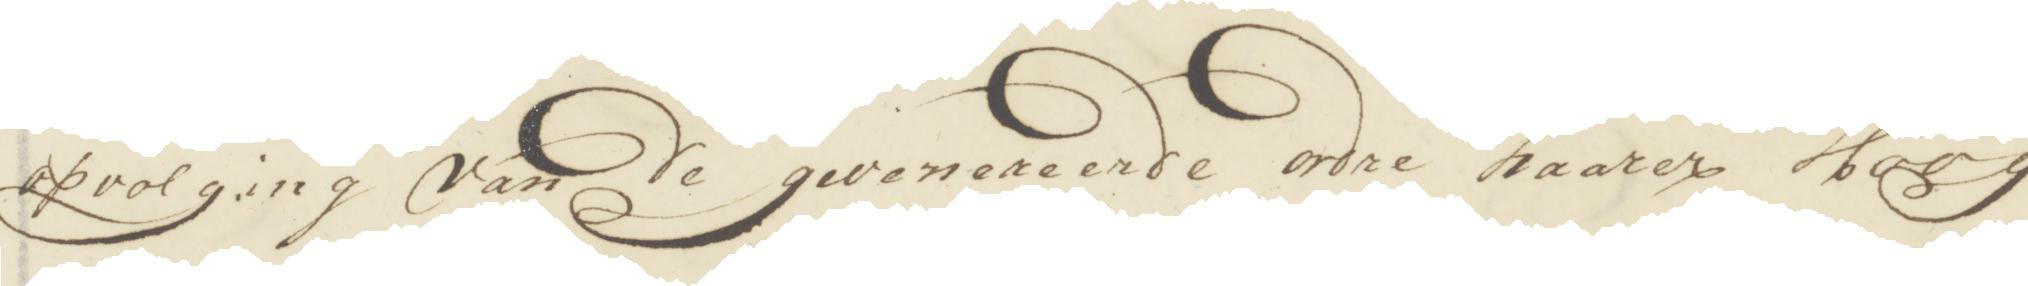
opvolging van de gevenereerde ordre haarer Hoog
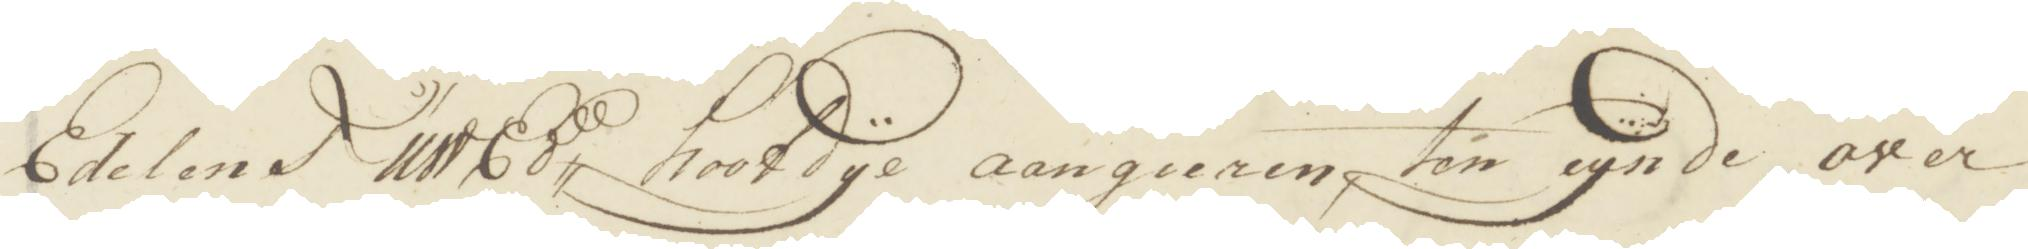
Edelens Uw Ed„l hoofdije aangieren, ten eijnde over
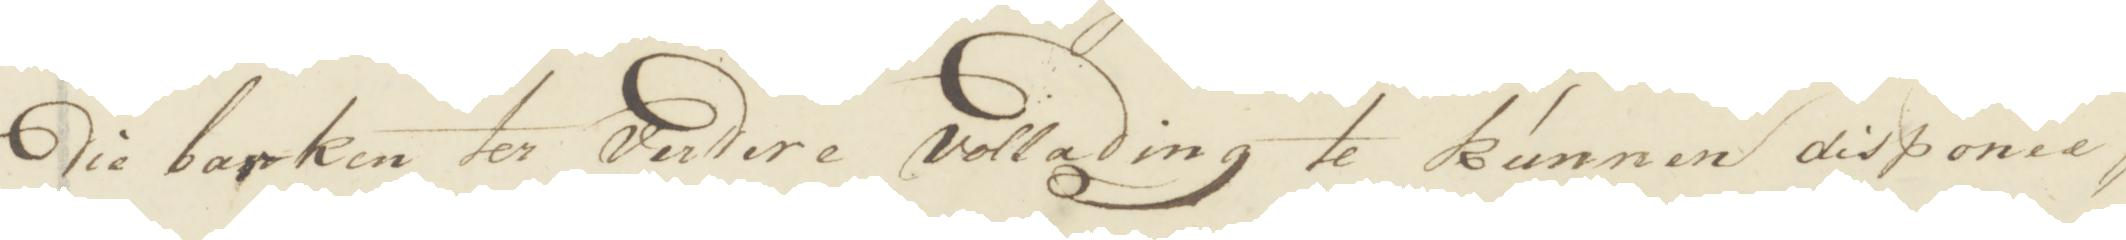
die barcken ter verdere vollading te kunnen disponee„
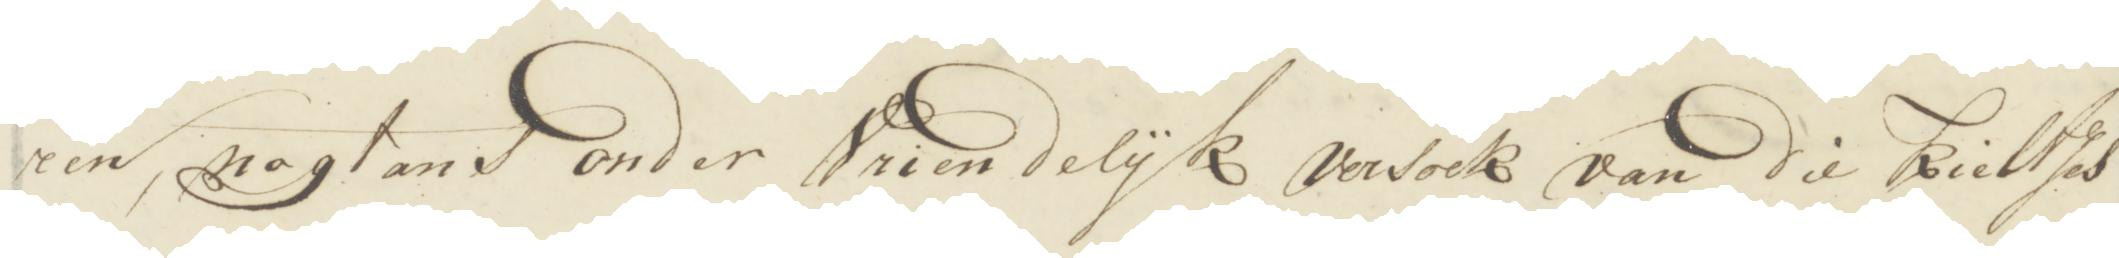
ren, nogtans onder Vriendelijk versoek van die briefjes
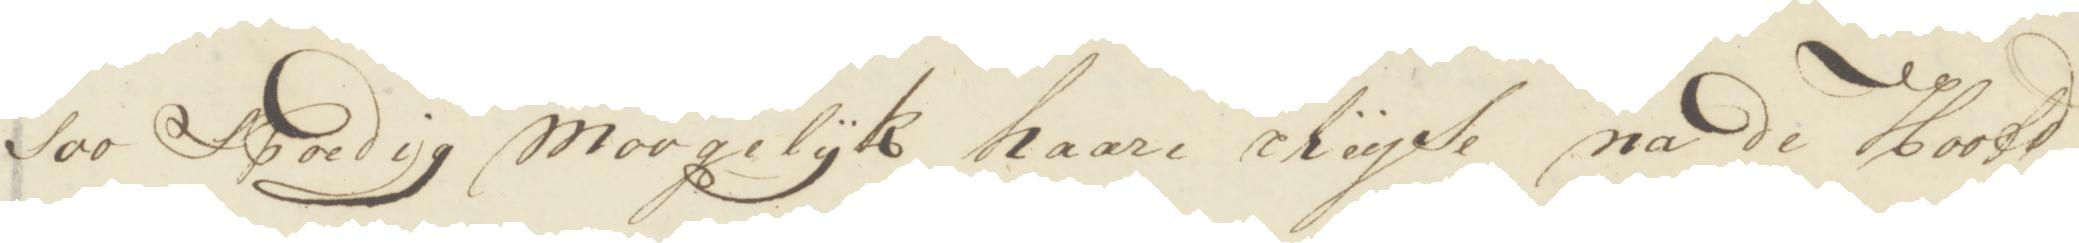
soo spoedig moogelijk haare rheijse na de Hoofd„
